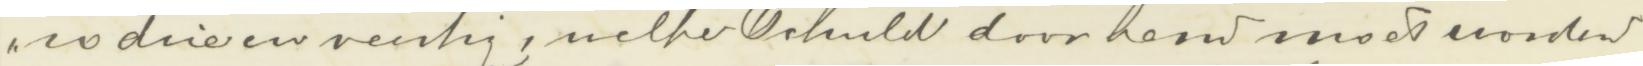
„ro drie en veertig, welke Schuld door hem moet worden
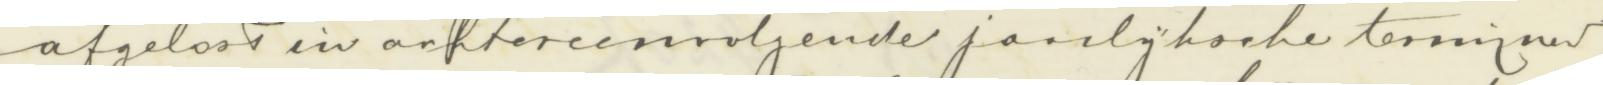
afgelost in achtereenvolgende jaarlijksche temijnen
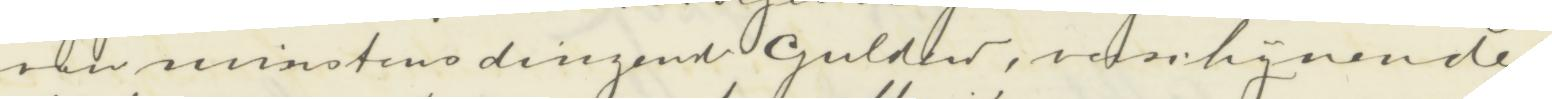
van minstens duizend Gulden, verschijnende
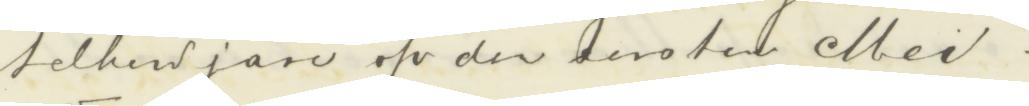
telken jare op den Eersten Mei
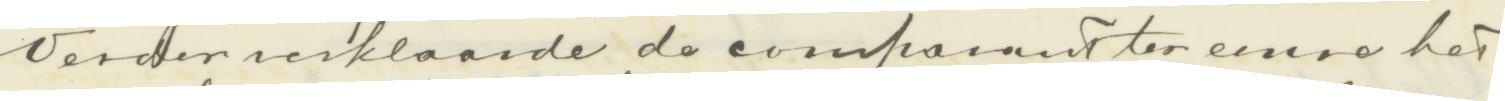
Verder verklaarde de comparant ter eenre het
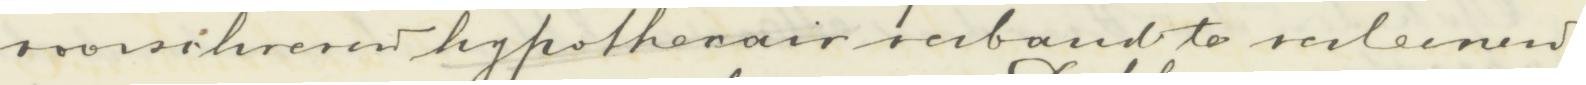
voorschreven hypothecair verband te verleenen
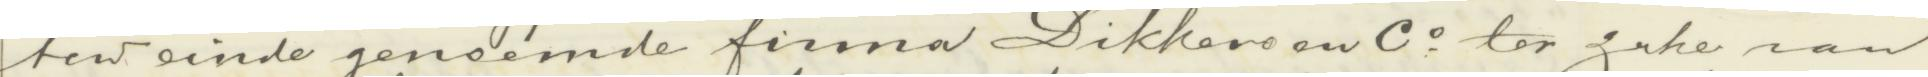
ten einde genoemde fima Dikkers en C.o ter zake van
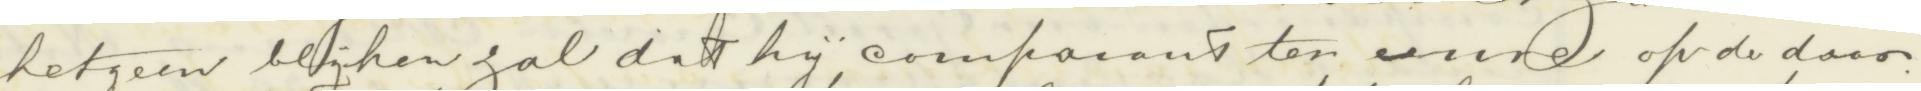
hetgeen blijken zal dat hij comparant ten eenre op de daar
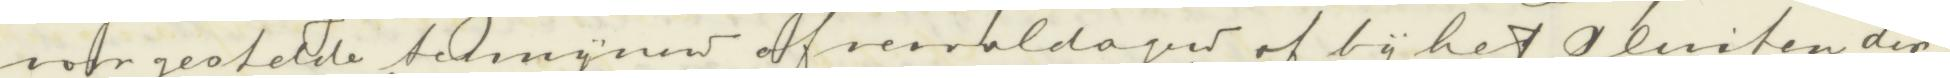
voorgestelde termijnen of vervaldagen of bij het sluiten der
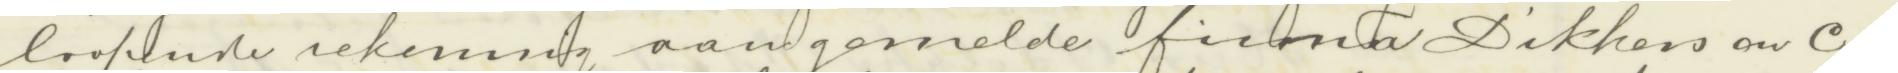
loopende rekening aan gemelde firma Dikkers en C„o
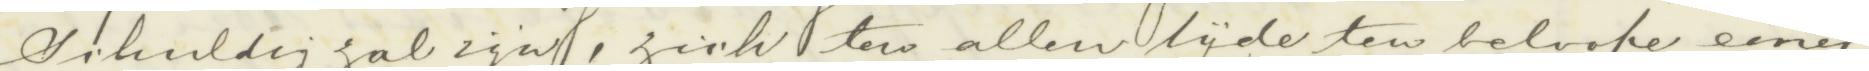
schuldig zal zijn, zich ten allen tijde ten beloope eener
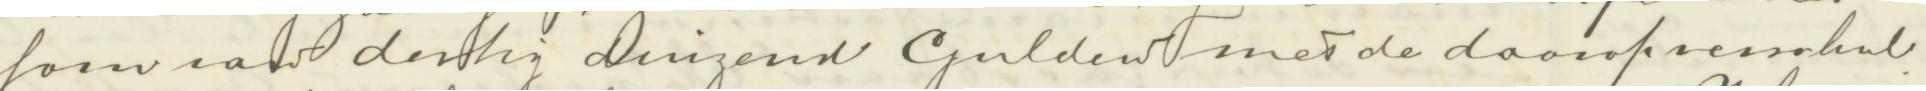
som van dertig duizend Gulden met de daarop verschul.
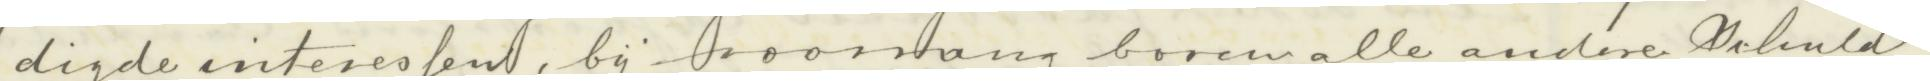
digde interessen, bij voorrang boven alle andere Schuld.
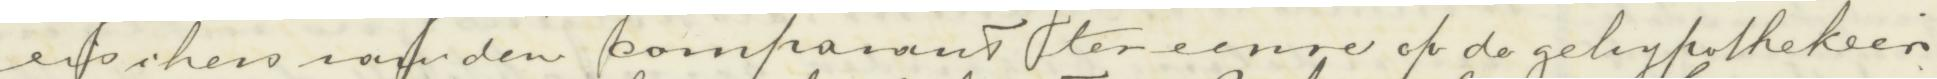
eischers van den comparant ter eenre op de gehypothekeer.
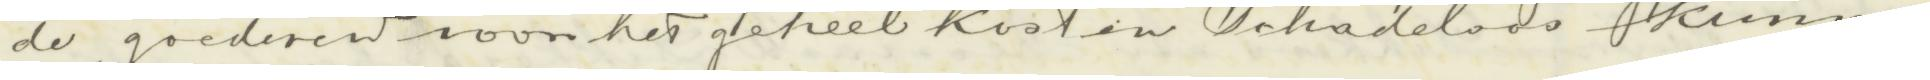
de goederen voor het geheel kost en schadeloos kunne
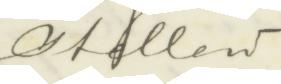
stellen
